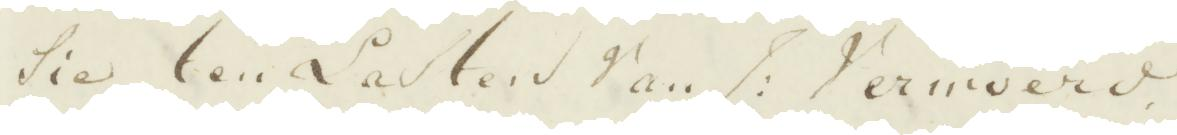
sie ten Lasten van J: Verwoerd,
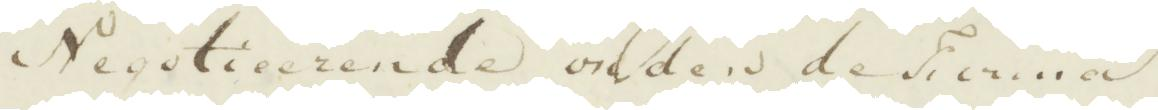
Negotieerende onder de Firma
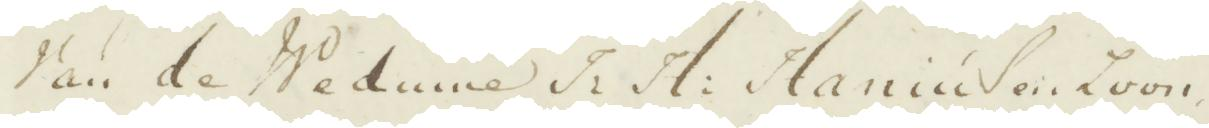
van de Weduwe I: H: Hanius en Zoon
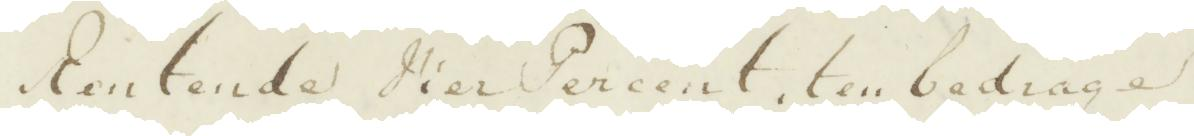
Een tende Vier Percent, ten bedrage
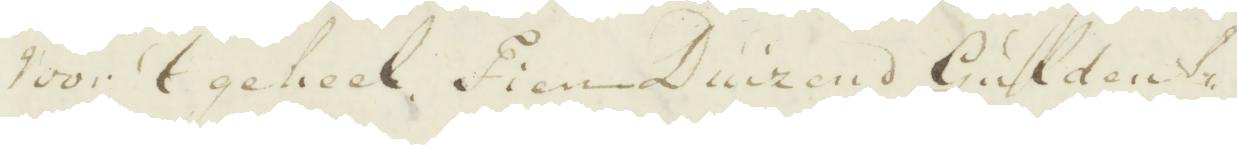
Voor 't geheel Tien Duizend Guldens„
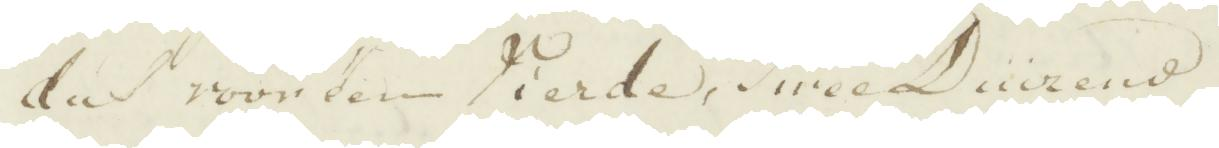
dus voor den Vierde, Twee Duizend
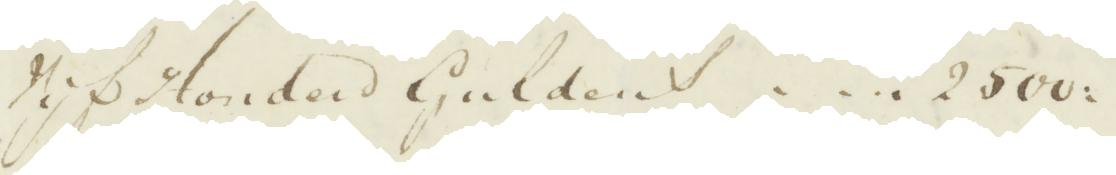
Vijf Honderd Guldens . . ƒ 2500:
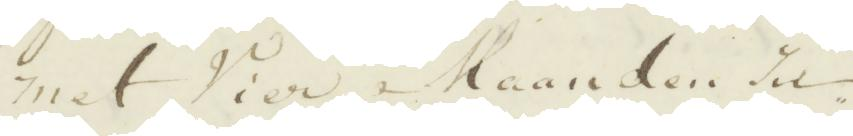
met Vier Maanden In
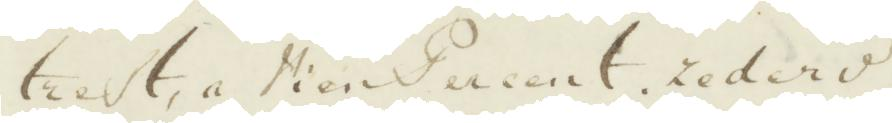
trest, a Vier Percent, zederd
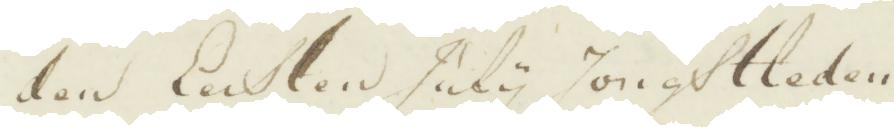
den Eersten Julij Jongstleden
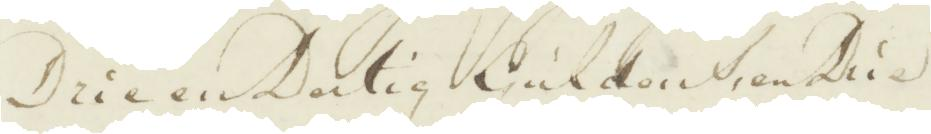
Drie en Dertig Guldens, en Drie
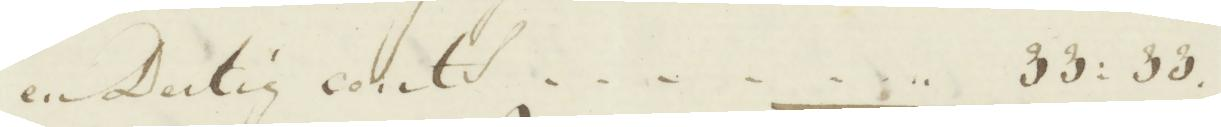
en Dertig cents - - - - - . .. 33: 33.
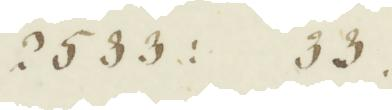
2533: 33
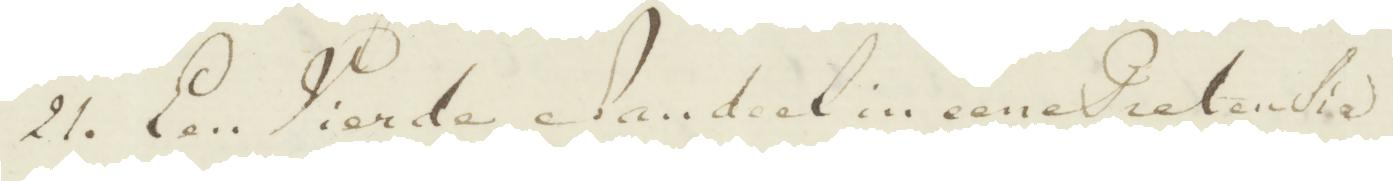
21. Een Vierden Aandeel in een Pretensie
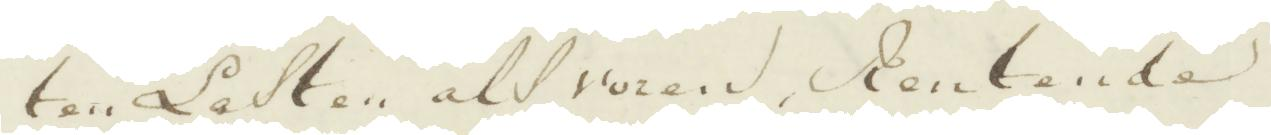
ten Lasten als voren, Rentende
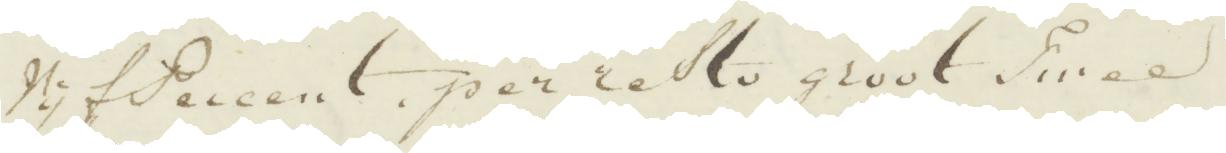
Vijf Percent, per resto groot Twee
